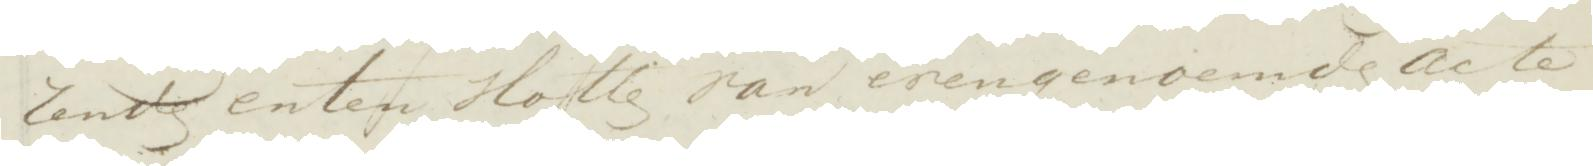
rende en ten slotte van evengenoemde acte
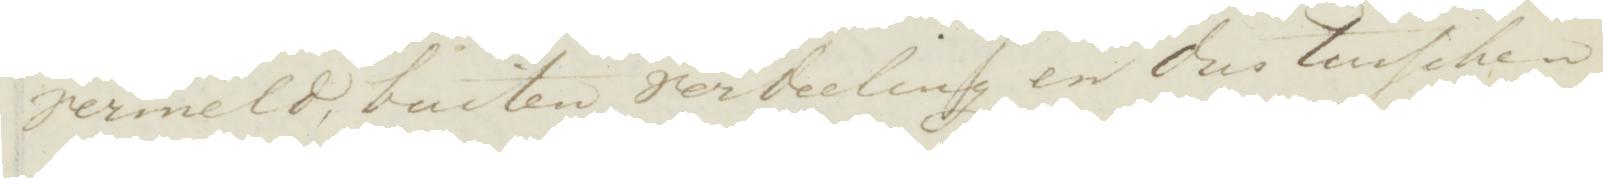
vermeld, buiten verdeeling en dus tusschen
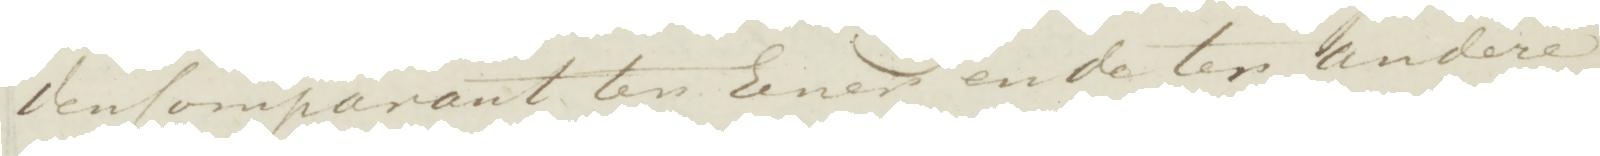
den Comparant ten Eener ende ter andere
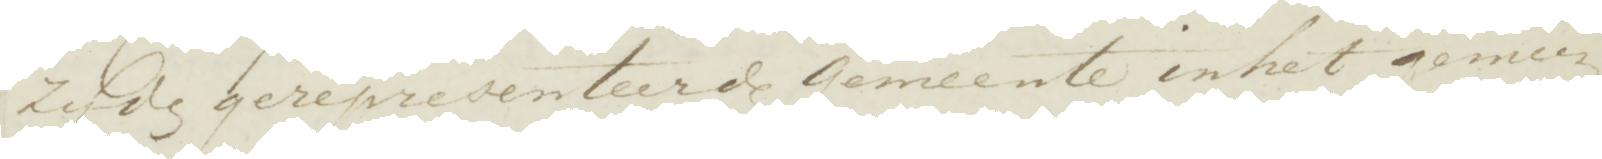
zyde gerepresenteerde Gemeente in het gemeen
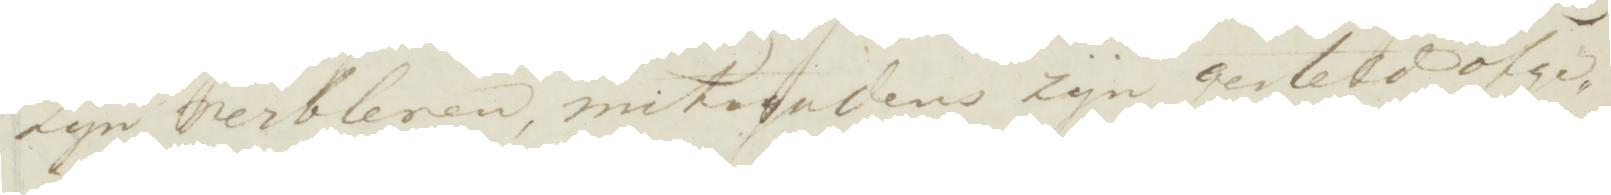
zijn verbleven, mitsgaders zijn gesteld of ge„
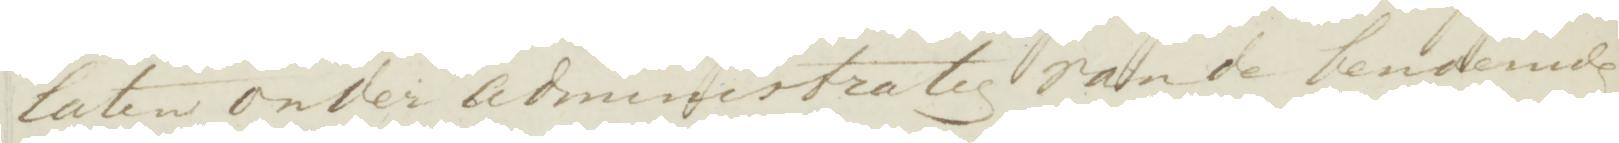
laten onder administratie van de benoemde
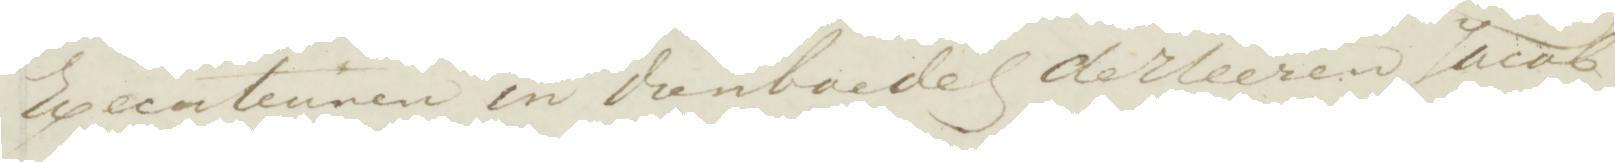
Executeuren in dien boedes de Heeren Jacob
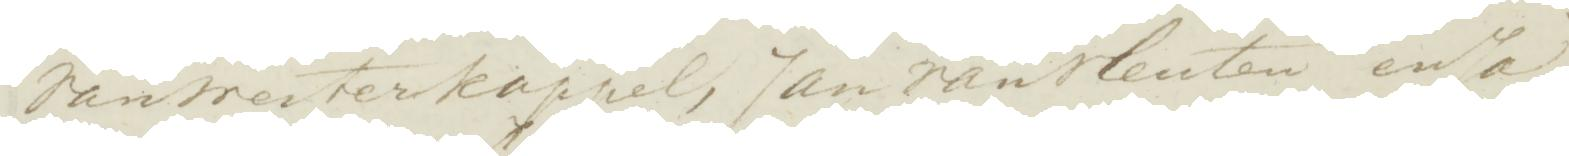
van Westerkappel, Jan van vleuten en Ja
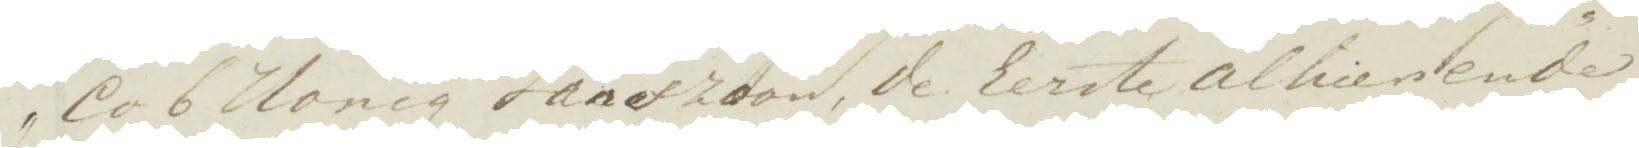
„Cob Honig Janszoon, de Eerste alhier ende
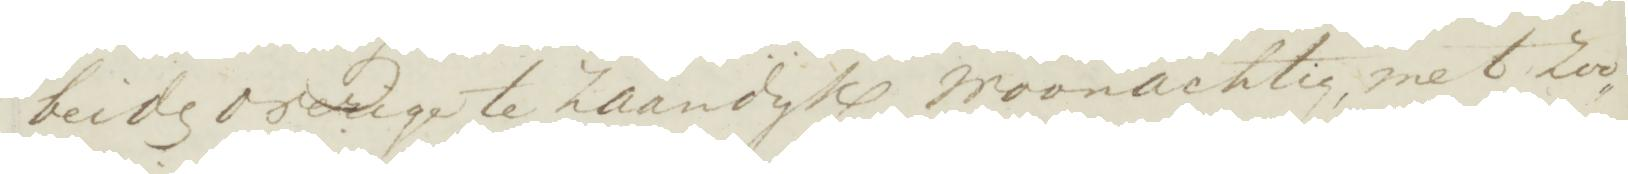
beide overige te zaandijk woonachtig, met zoo„
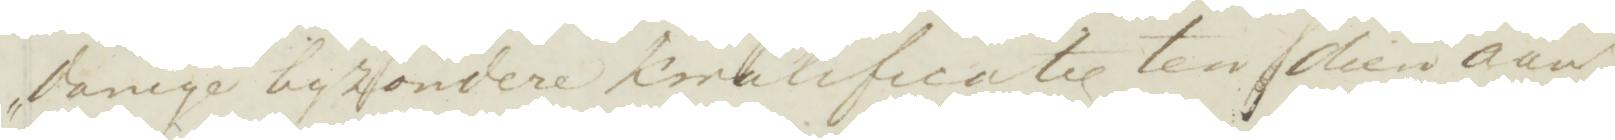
„danige bijzondere kwalificatie ten dien aan
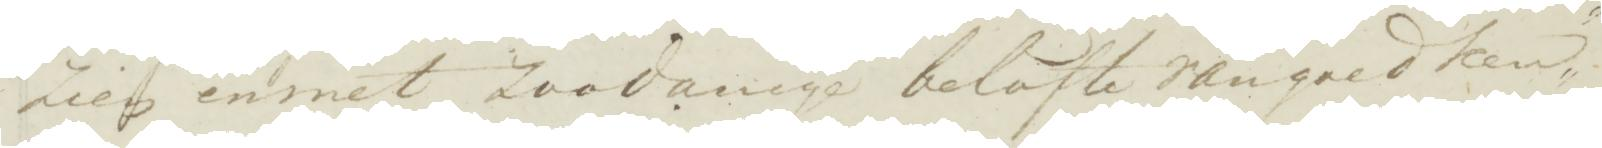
zien en met zoodanige belofte van goed keu„
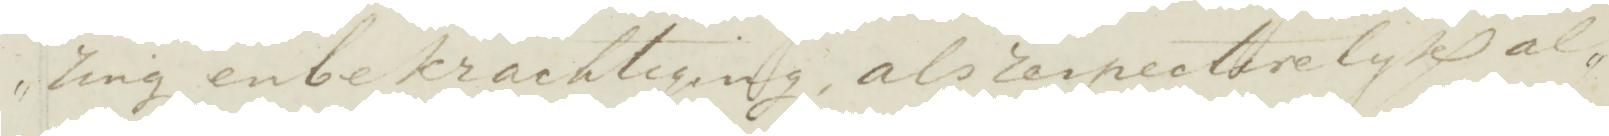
„ring en bekrachtiging, als respectivelyk al
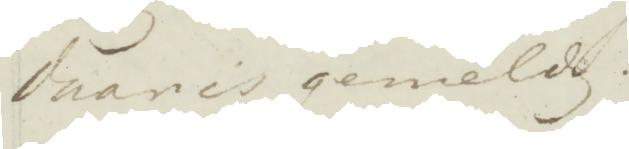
daar is gemeld
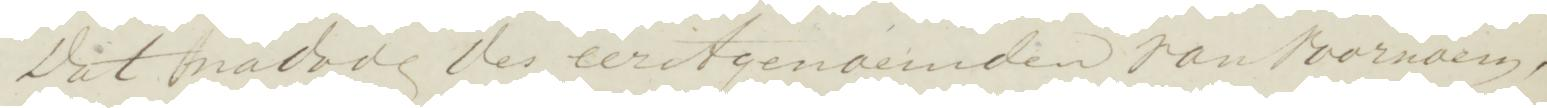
Dat na dode des eerstgenoemden van voornoem,
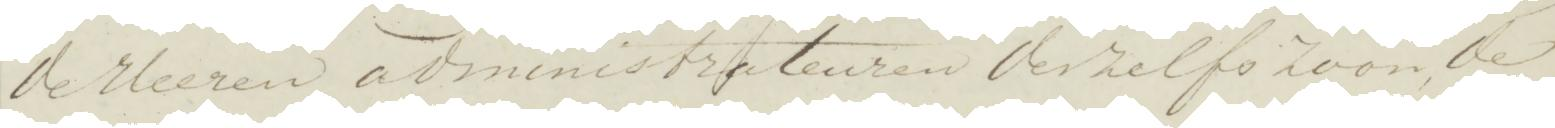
de Heeren administrateuren derzelfs zoon, de
